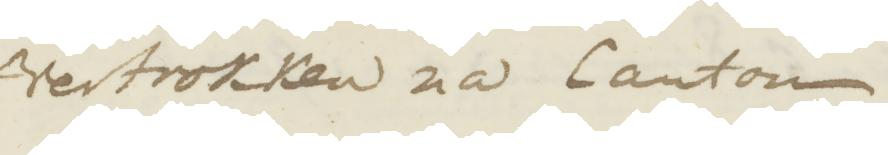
vertrokken na Canton
